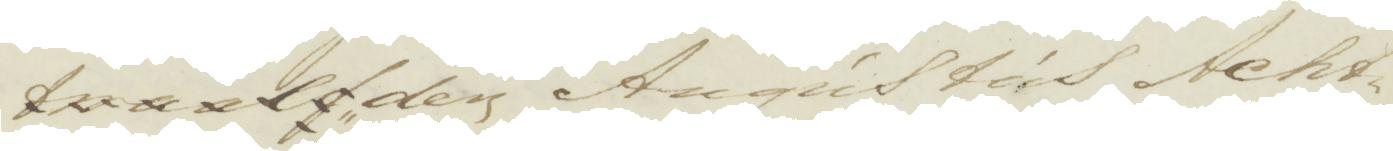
twaalf„den Augustus Acht„
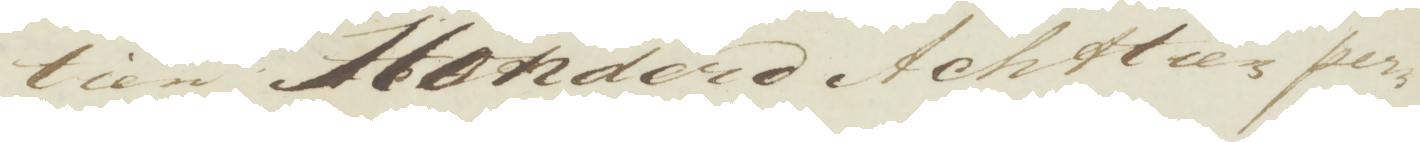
tien Honderd Achttien per
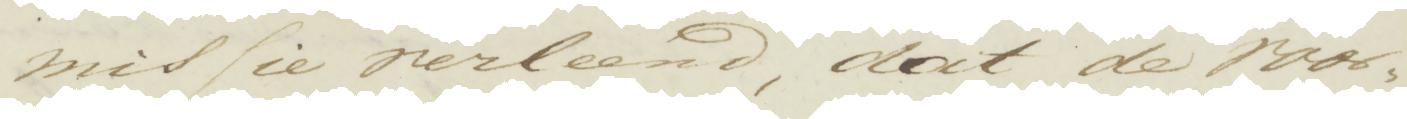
missie verleend, dat de voor„
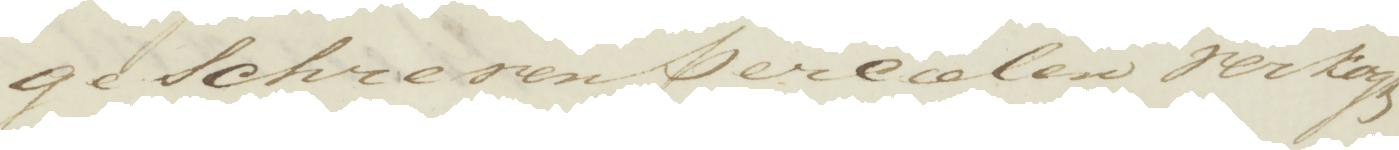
geschreven perceelen verkogt
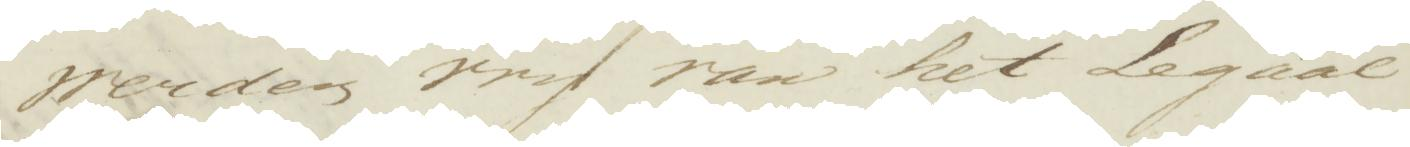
werden vry van het Legaal
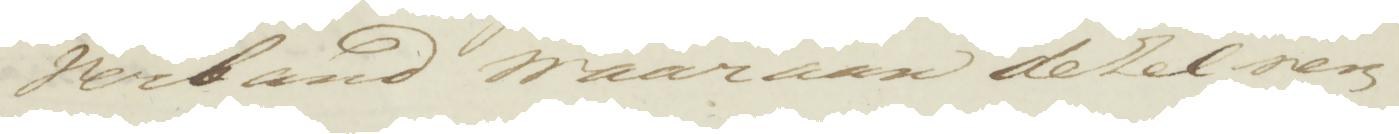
verband waaraan dezelven
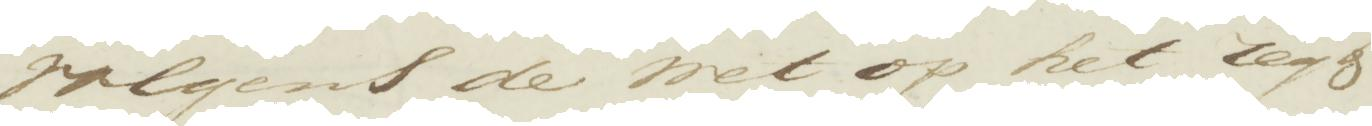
volgens de wet op het regt
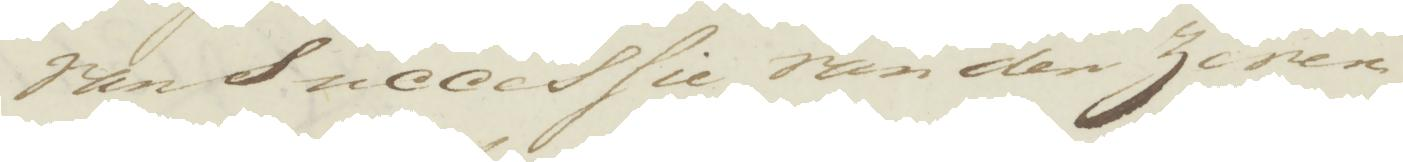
van Successie van den zeven
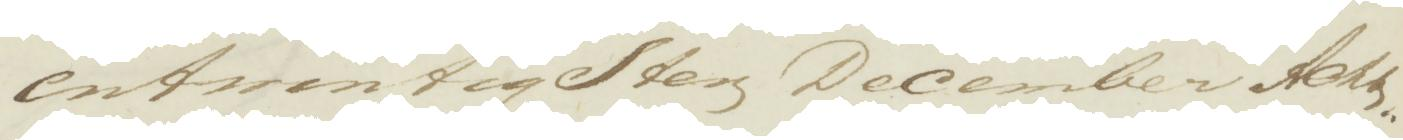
en twintigsten December Acht„
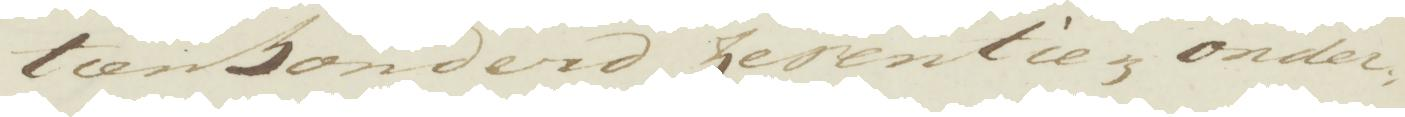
tienhonderd zeventien onder„
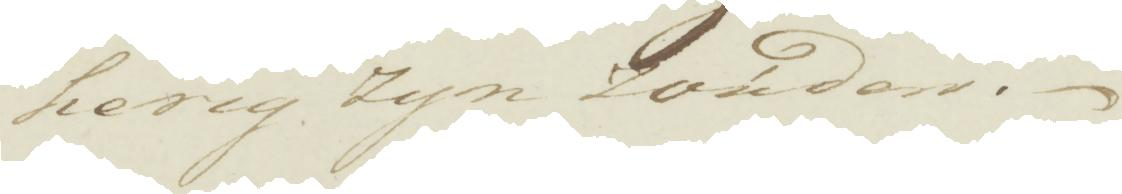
horig zyn zouden.
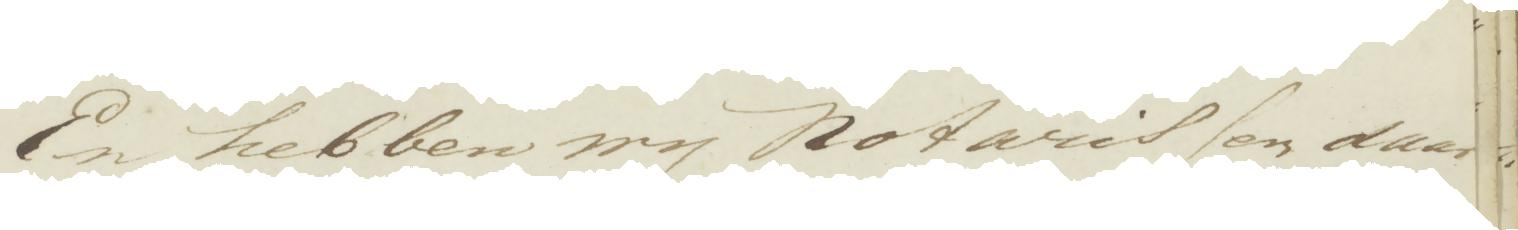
En hebben wy Notarissen daar
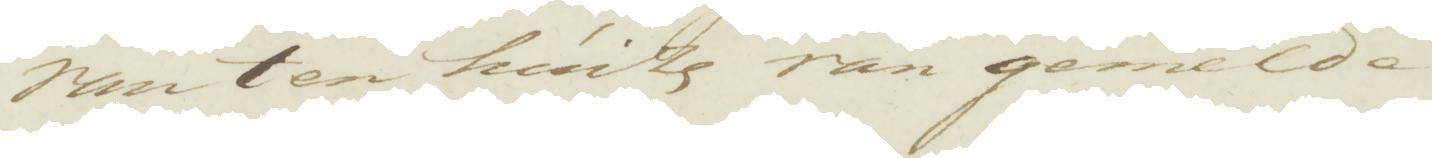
van ten huize van gemelde
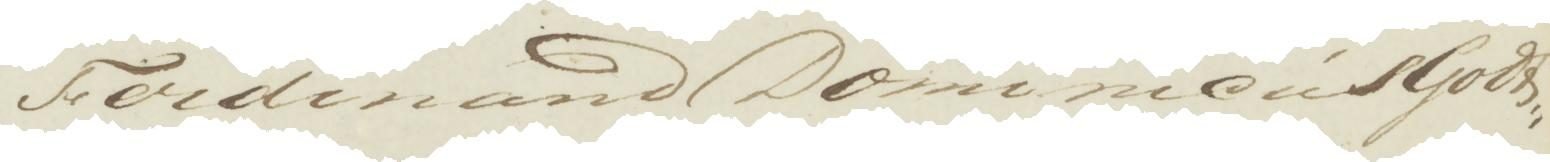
Ferdinand Dominicus Gode„
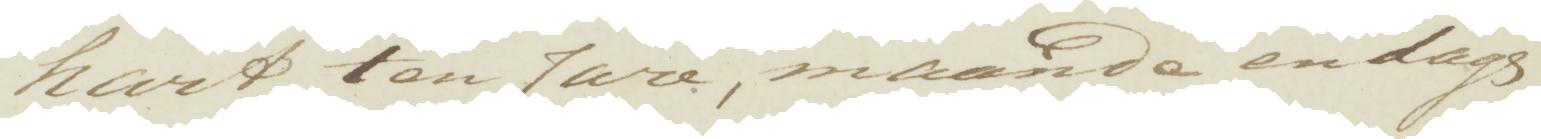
hart, ten Jare, maande en dagen
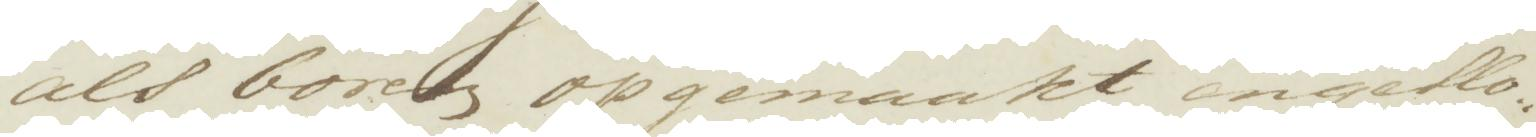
als boven opgemaakt en geslo„
